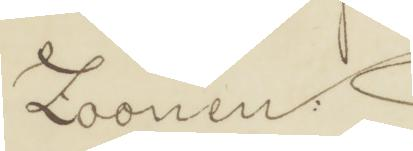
zoonen:
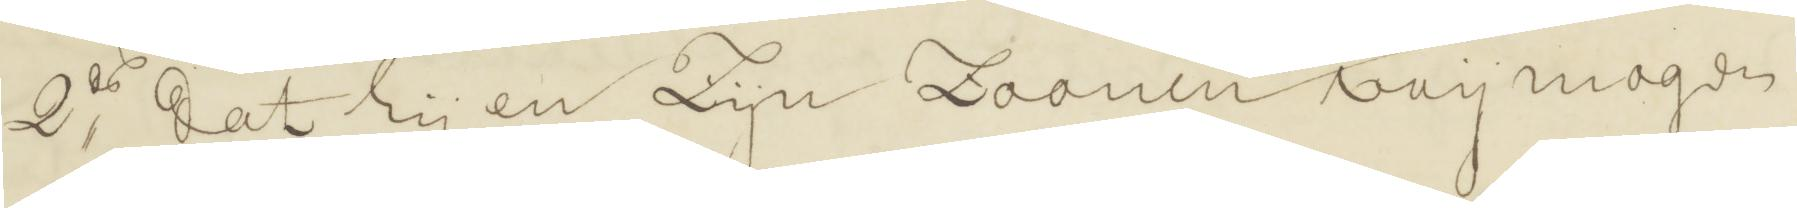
2„e dat hij en zijn zoonen vrij mogen
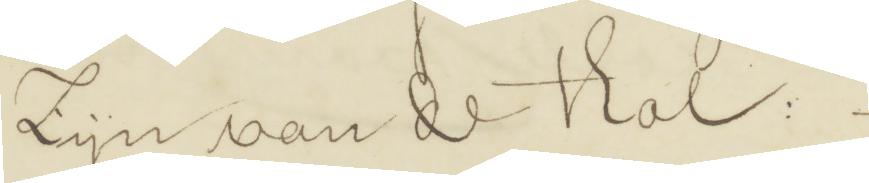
zijn van de thol:
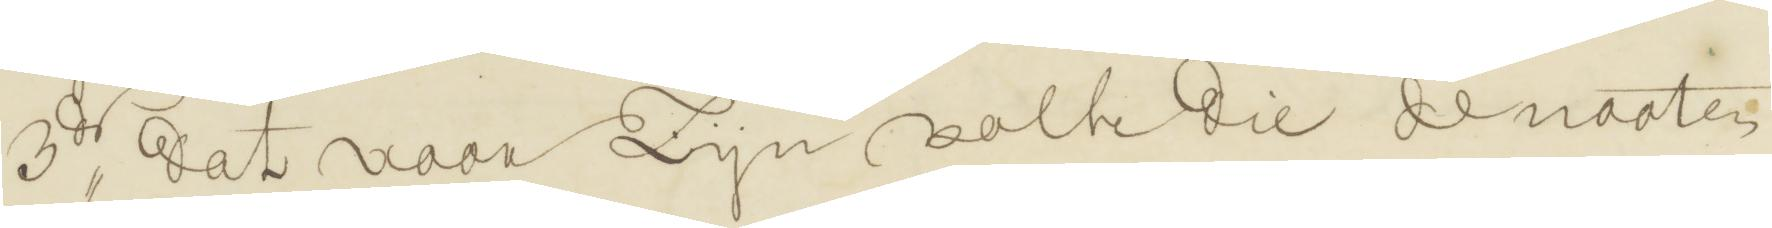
3„e dat voor zijn volk die de nooten
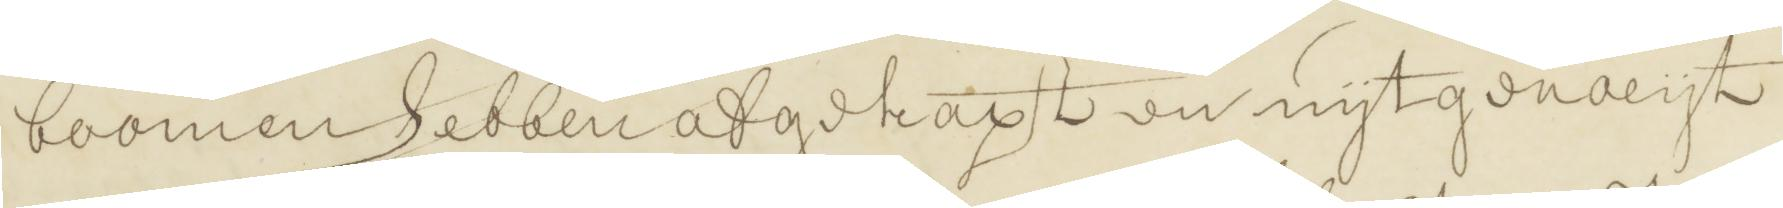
boomen hebben afgekapt en uijtgeroeijt
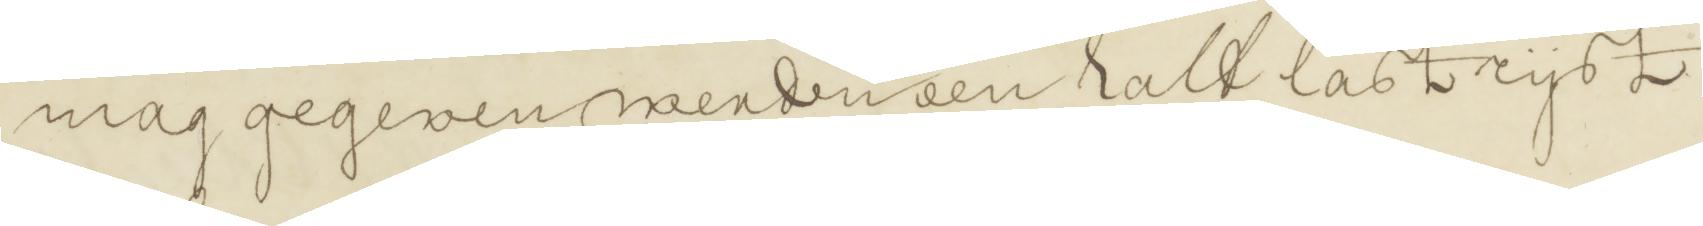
mag gegeven werden een half last rijst
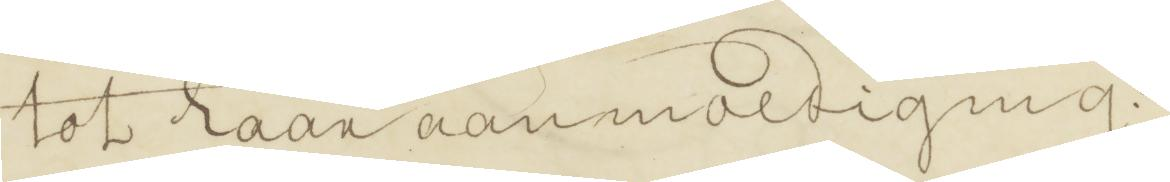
tot haar aanmoediging:
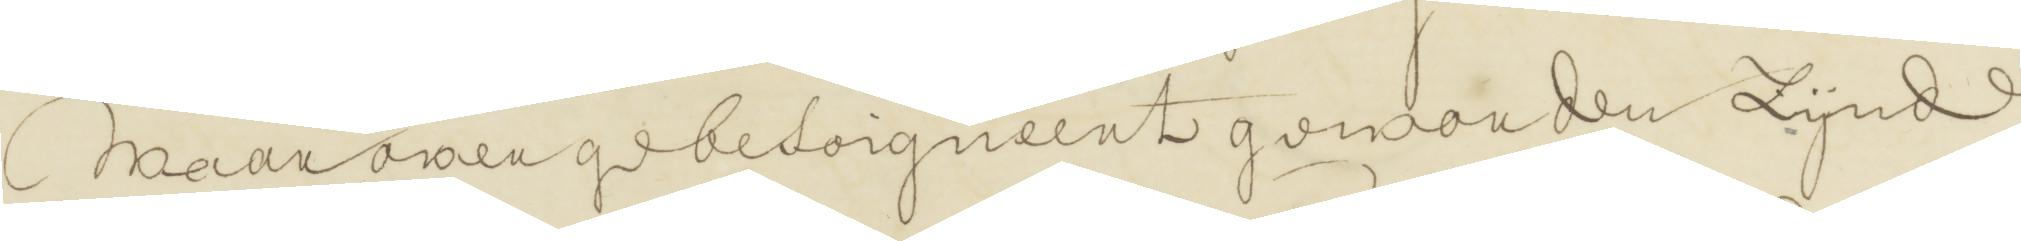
waar over gebesoigneert geworden zijnde
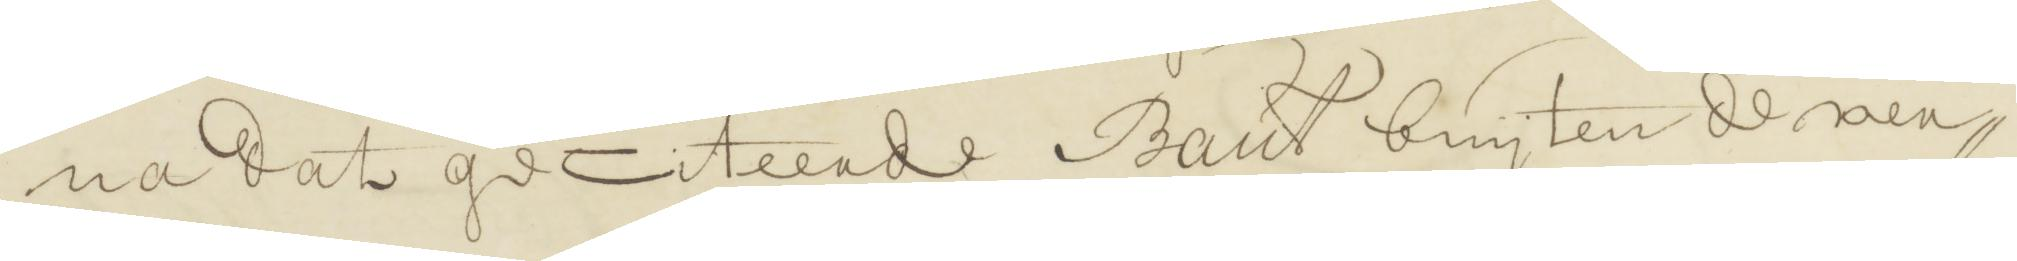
na dat geciteerde Baut buijten de ver„
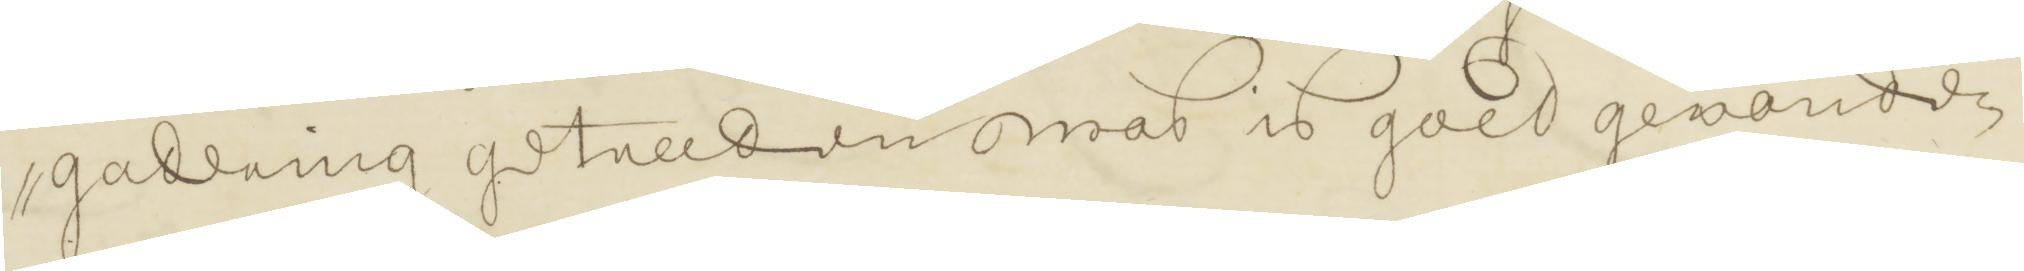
„gadering getreeden was is goed gevonden
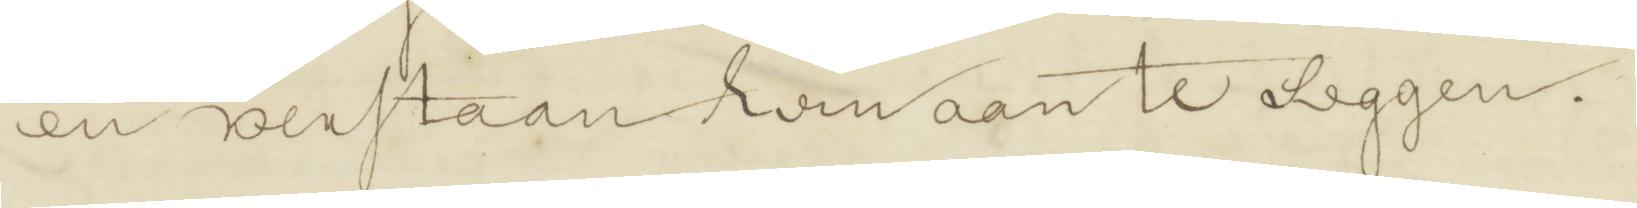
en verstaan hem aan te seggen.
